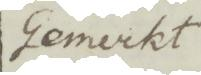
Gemerkt
